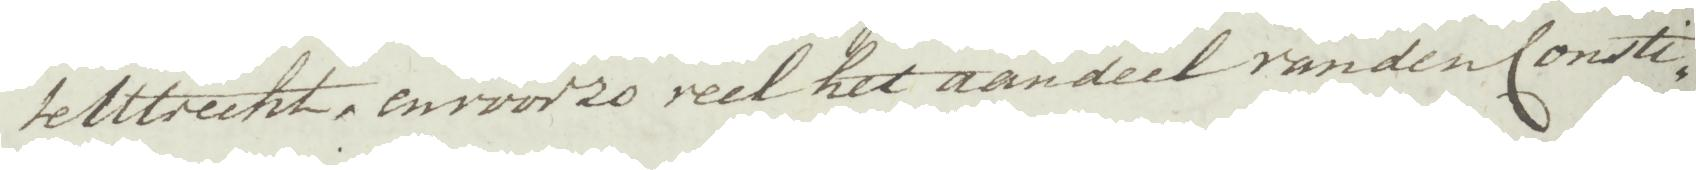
te Utrecht, en voor zo veel het aandeel van den Consti„
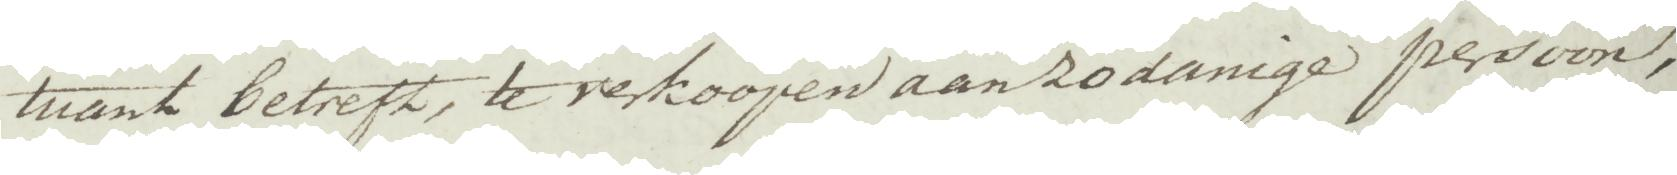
tuant betreft, te verkoopen aan zodanige persoon,
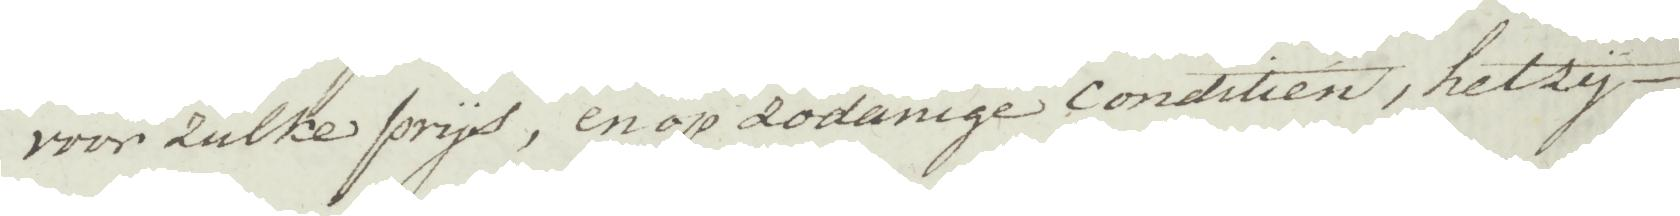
voor zulke prijs, en op zodanige conditien, hetzij
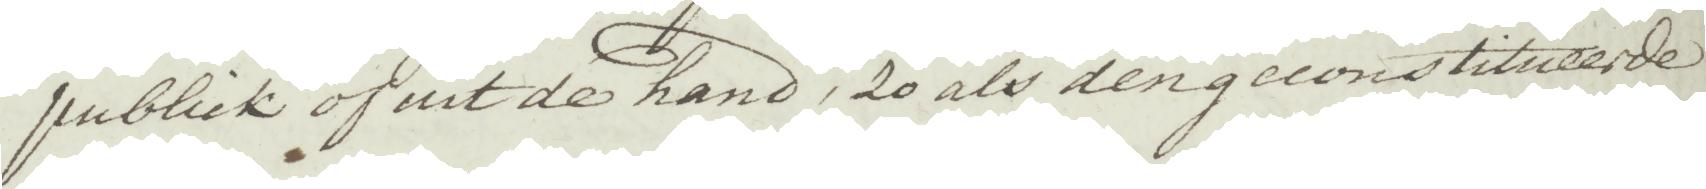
publiek of uit de hand , zo als den geconstitueerde
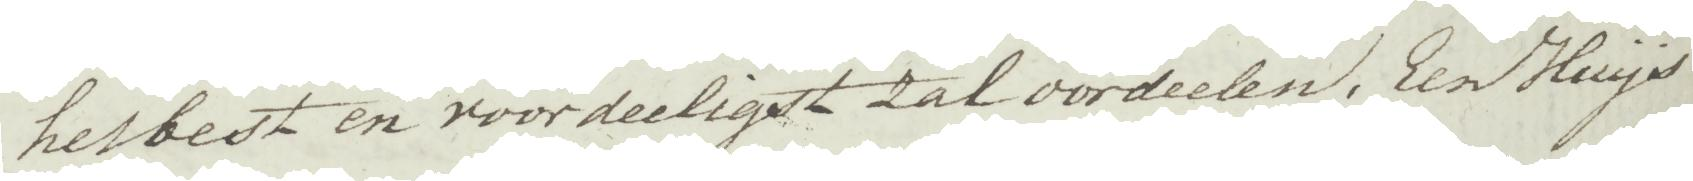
het best en voordeeligst zal oordeelen, Een Huijs
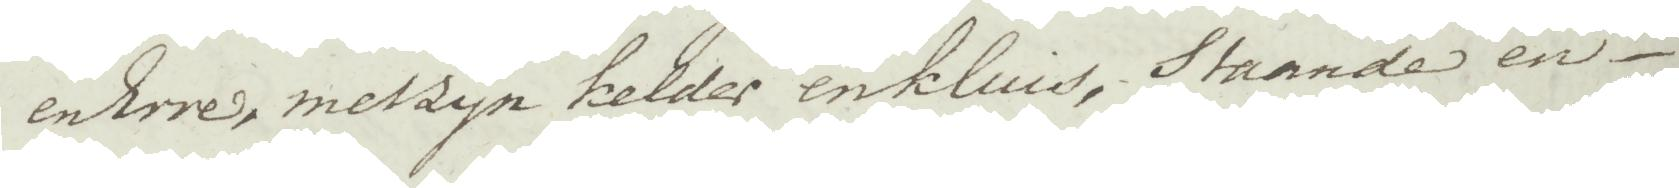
en Erve, met zijn kelder en kluis, staande en —
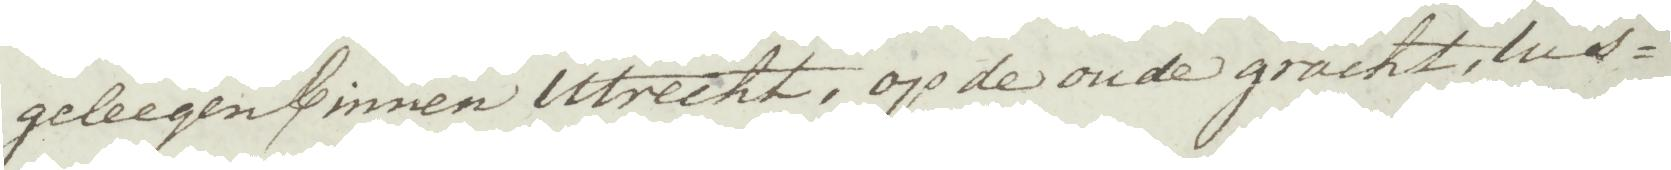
geleegen binnen Utrecht, op de oude gracht, tus=
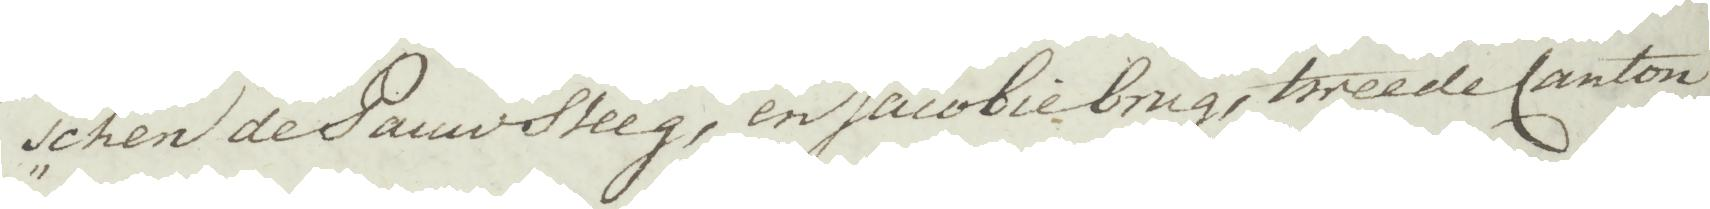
„schen de Pauwsteeg, en Jacobiebrug, tweede Canton
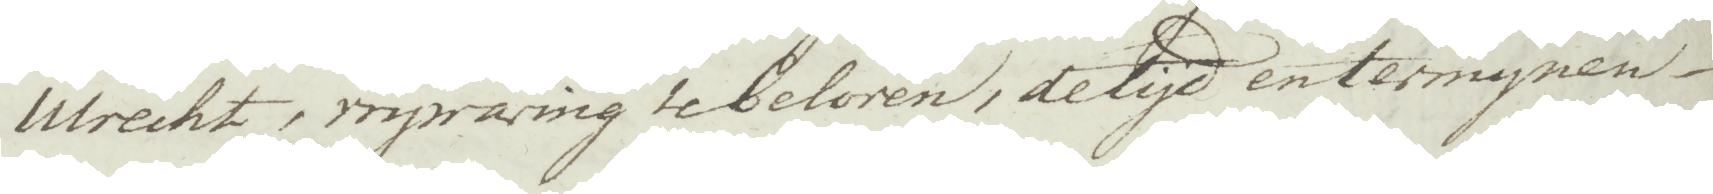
Utrecht, vrijwaring te beloven, de tijd en termijnen
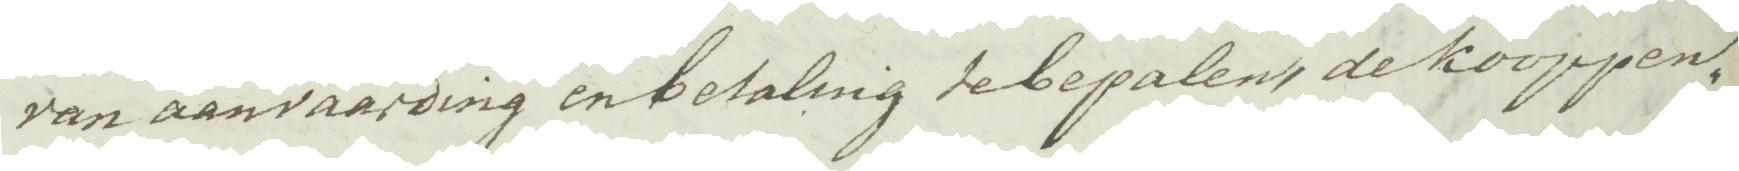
van aanvaarding en betaling te bepalen, de kooppen„
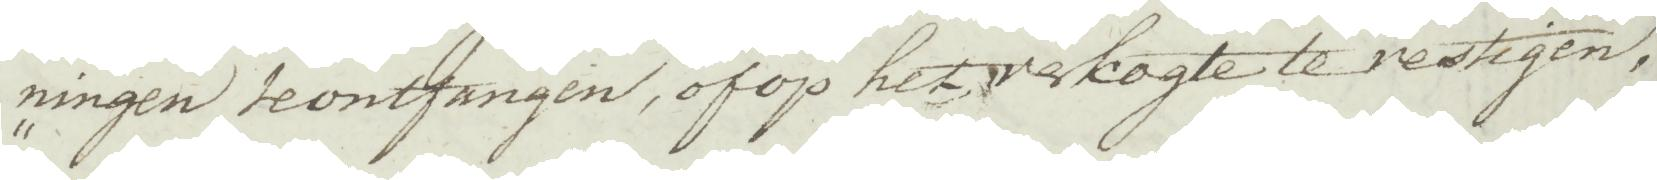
„ningen te ontfangen, of op het verkogte te vestigen,
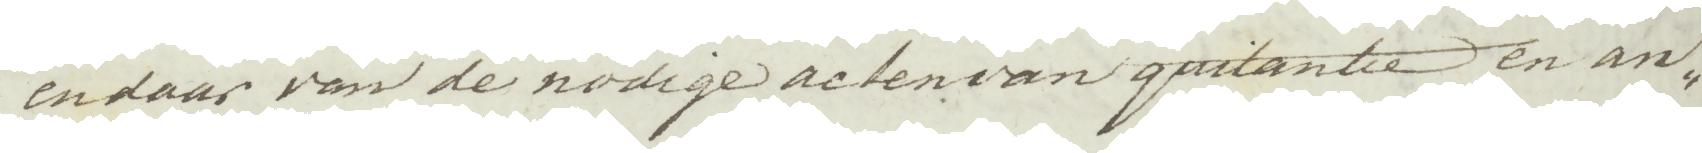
en daar van de nodige acten van quitantie en an„
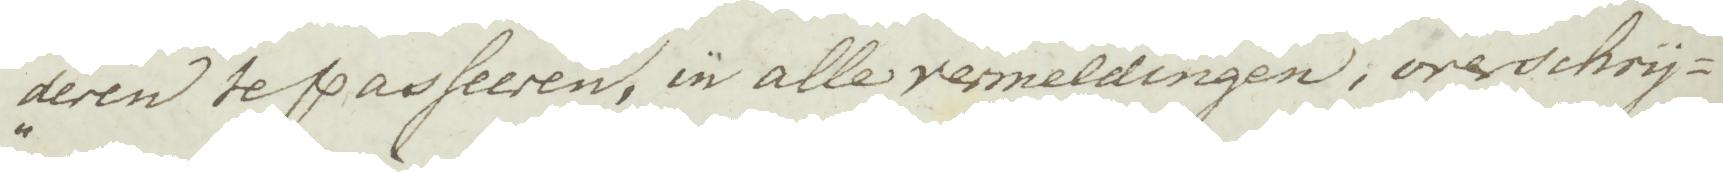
„deren te passeeren, in alle vermeldingen, overschrij„
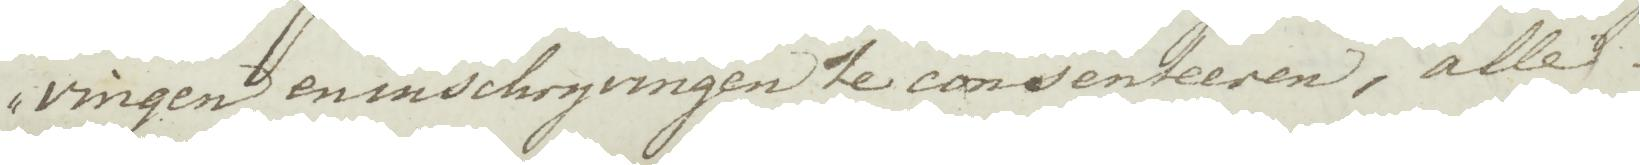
„vingen en inschrijvingen te consenteeren, alles
